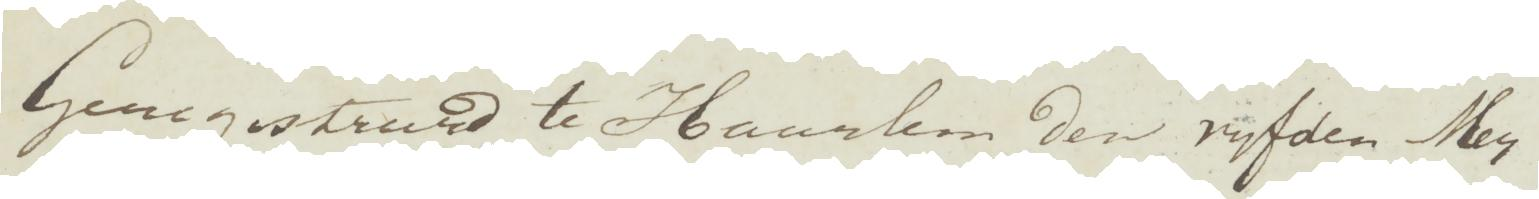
Geregistreerd te Haarlem den vyfden Mey
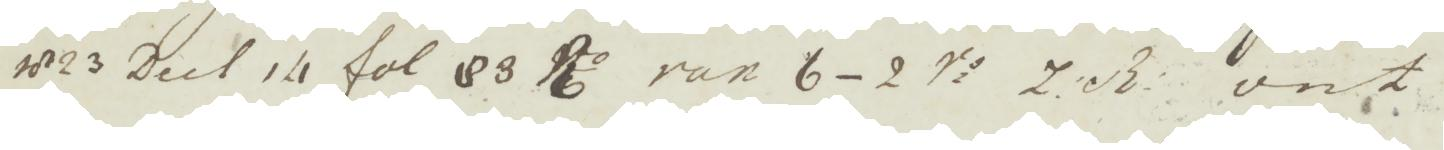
1823 Deel 14 fol 83 R=o van 6 — 2 v:o z: R: ont
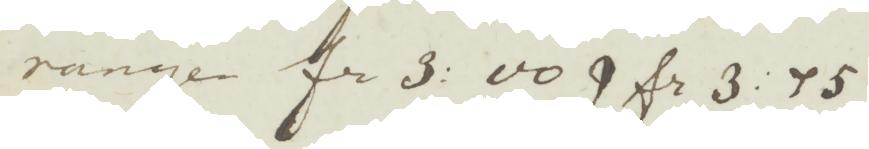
vangen fr 3: 00 } fr 3: 75
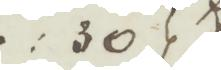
—: 30 }
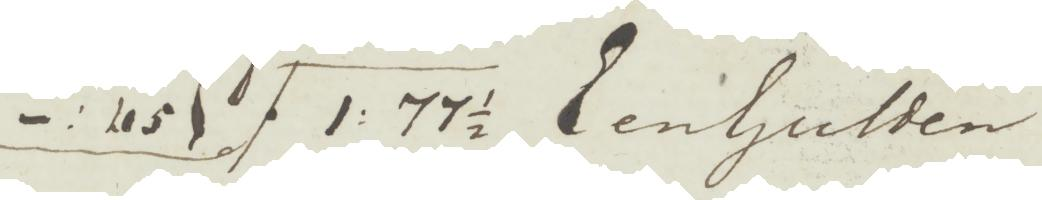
—: 45 ƒ 1: 77½ Een Gulden
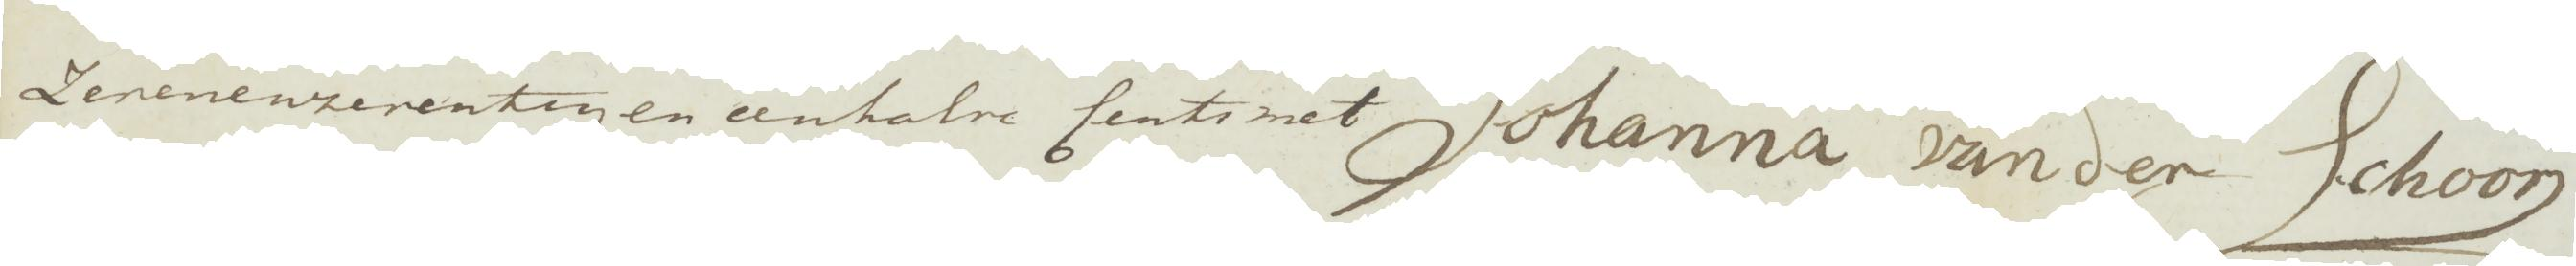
Zevenenzeventig en een halve Cents met Johanna van der Schoor
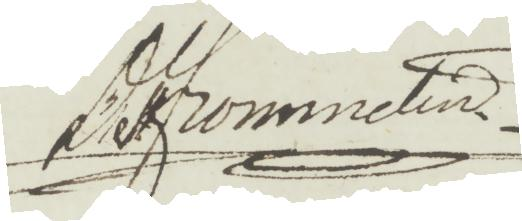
D: Crommelin.
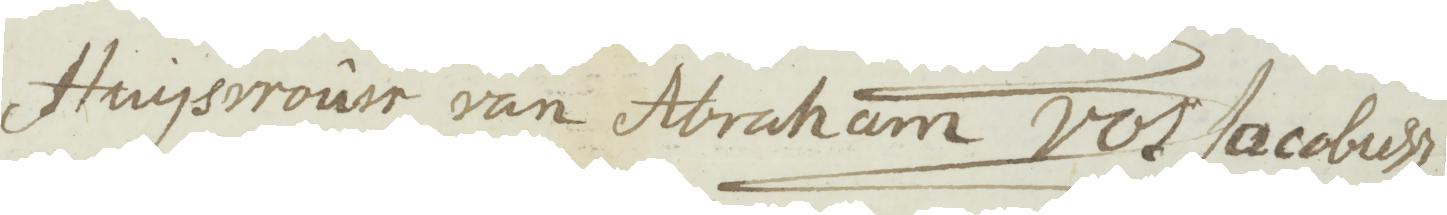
Huijsvrouw van Abraham Vos Jacobusz
